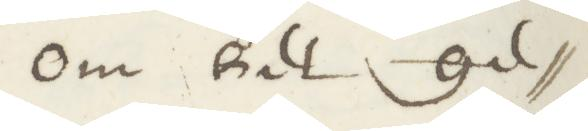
om het ge„
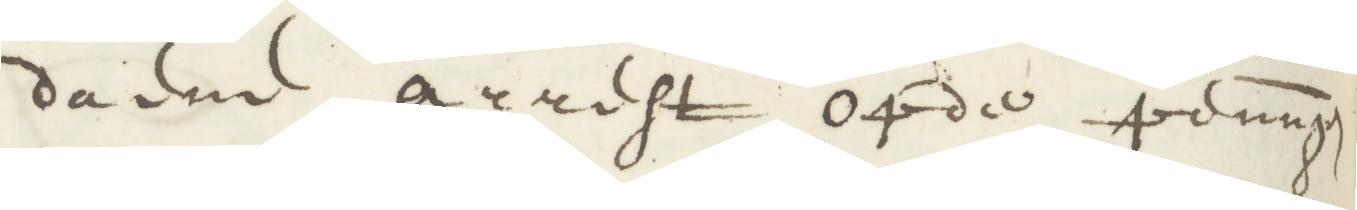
daene arrest op de penngen
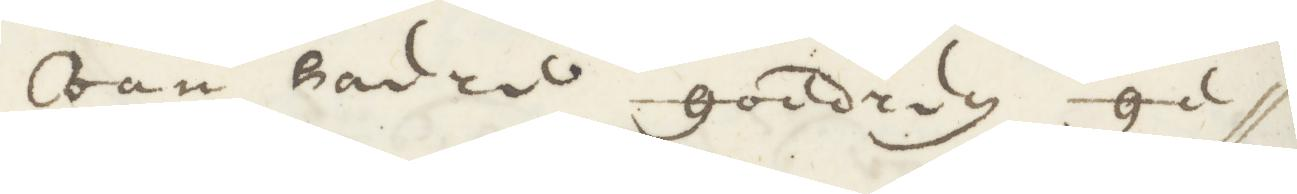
van haere goedren ge„
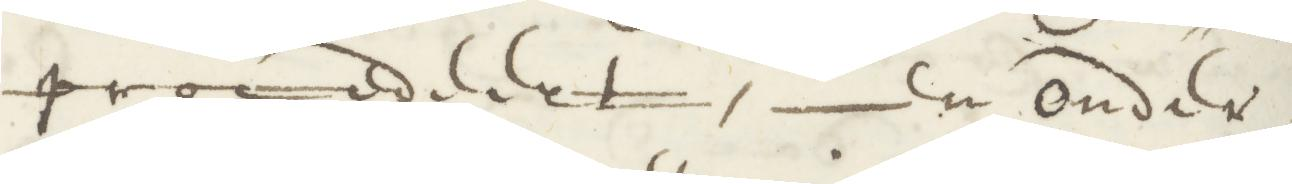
procedeert, en onder
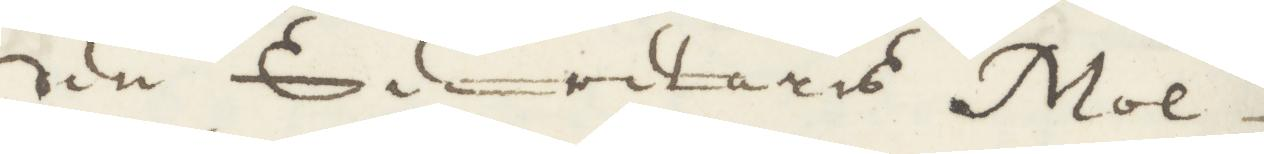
den Secretaris Mol
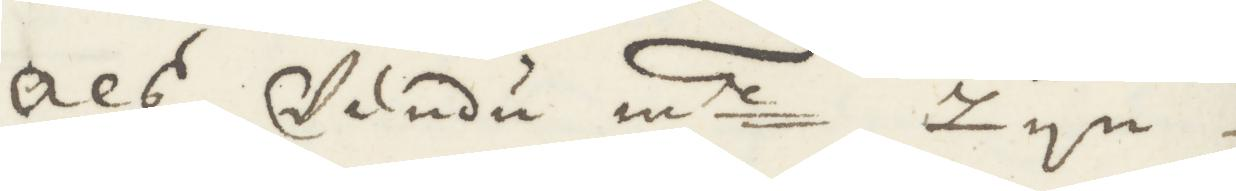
als Vendu m=r zijn.
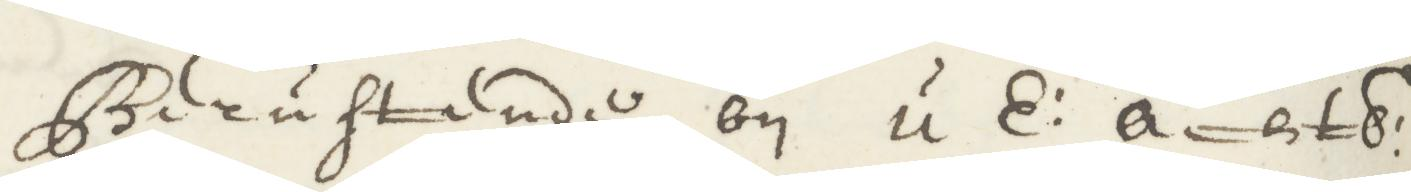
Berustende bij u E: achtb:
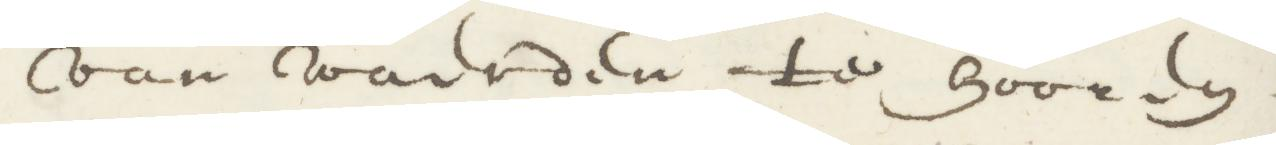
van waerden te hooren
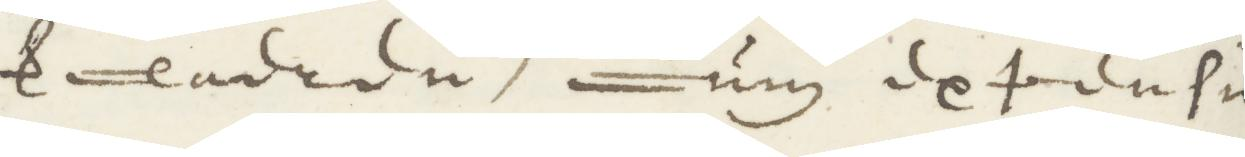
verclaeren, cum expensis/.
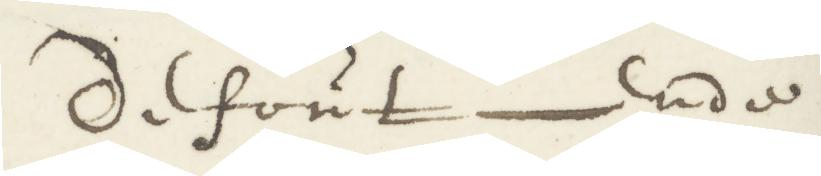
defout ende
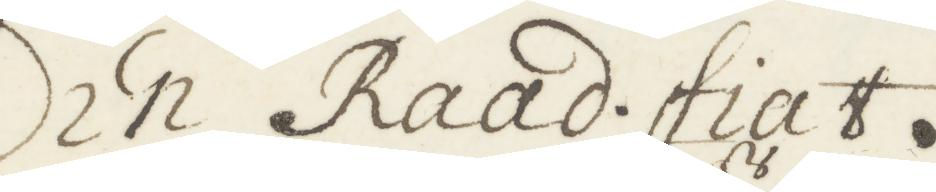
en Raad. fiat.
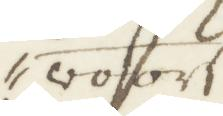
„ voors
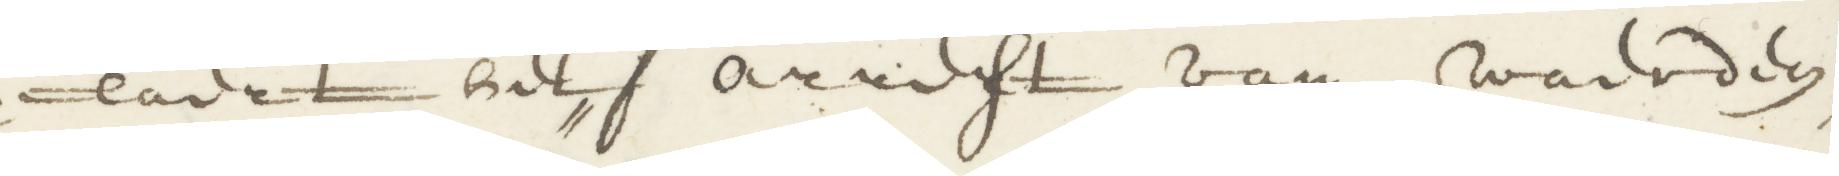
verclaert het„ arrest van waerden
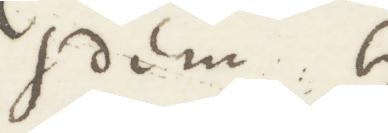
Jdem h
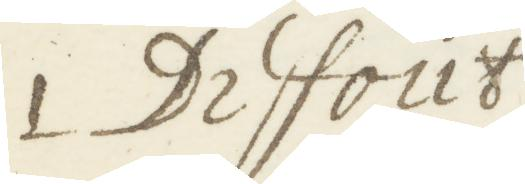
1 Defout
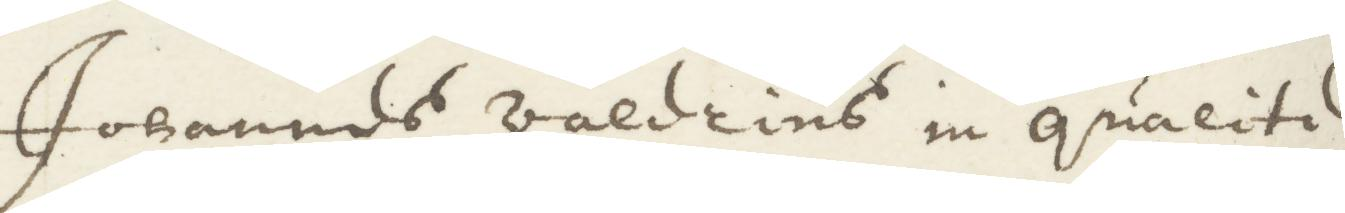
Johannes valerius in qualite
